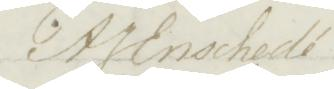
A J Enschedé
